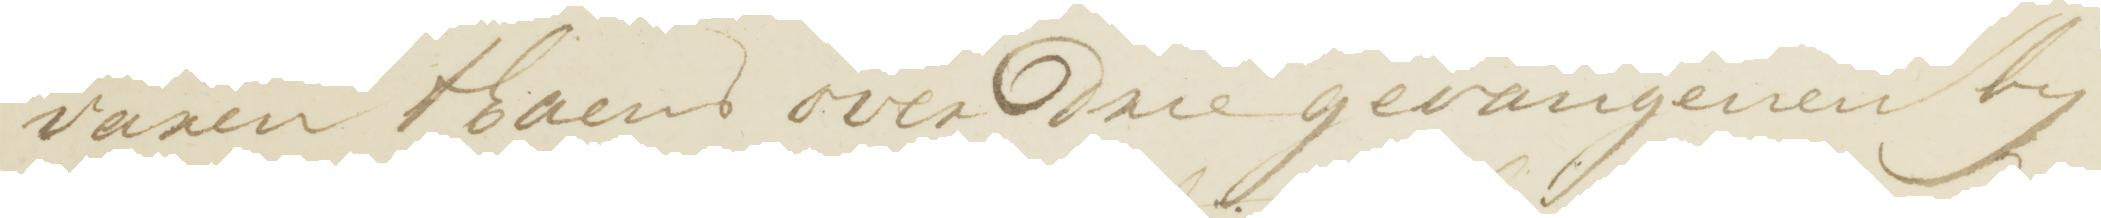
varen thaens over drie gevangenen bij
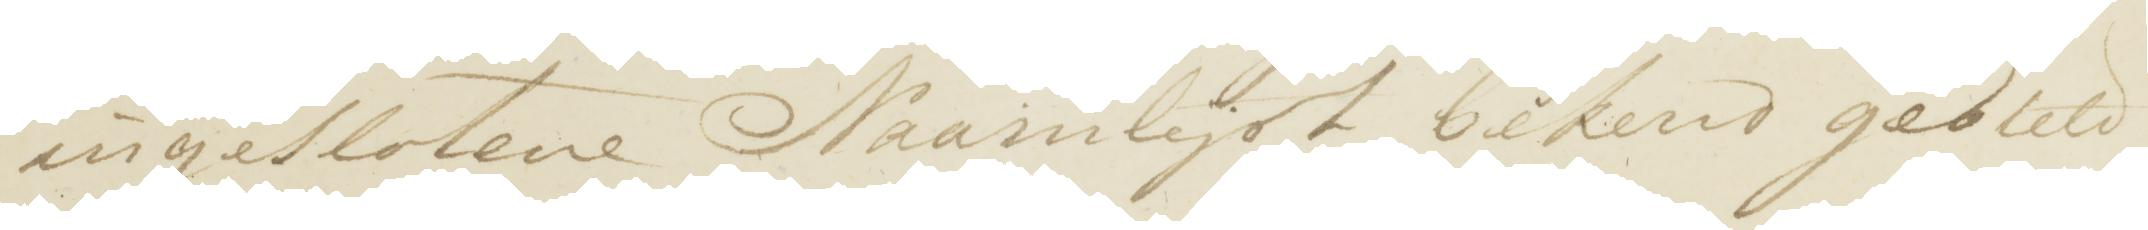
angeslotene Naamlijst bekend gesteld
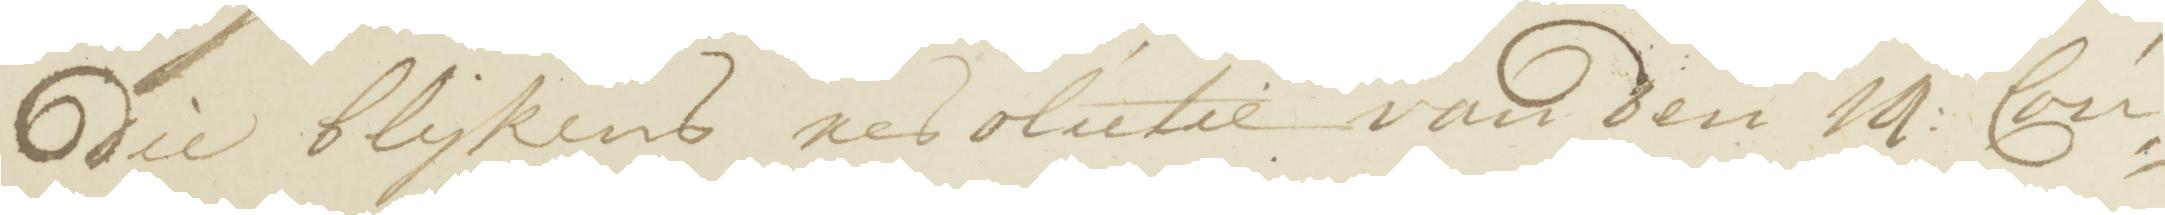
die blijkens resolutie van den 14: Cou„
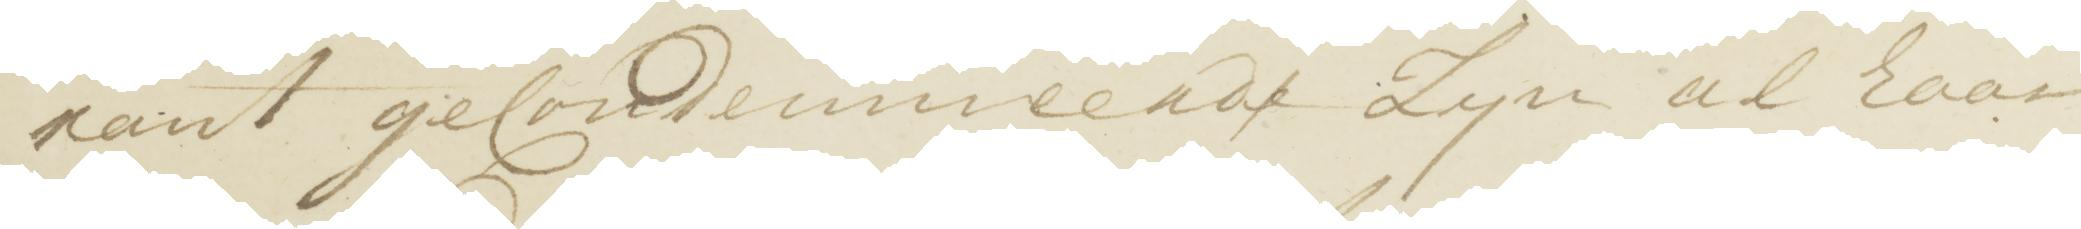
rant gecondemneerde zijn al haar
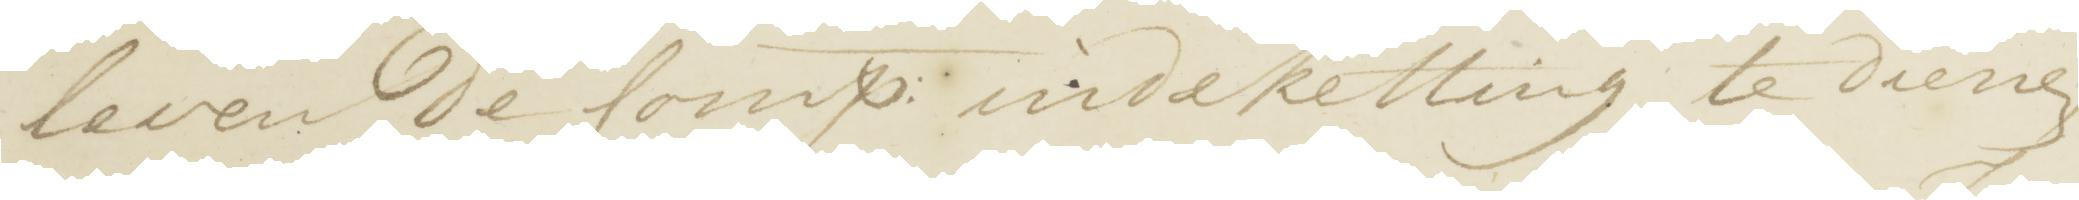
leven de Comp: in de ketting te dienen,
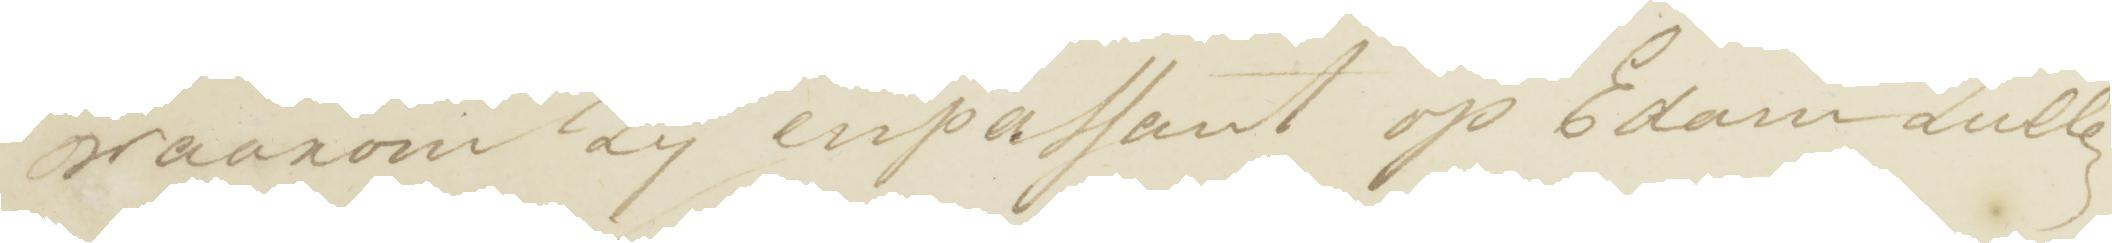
waarom zij enpassant op Edam zullen
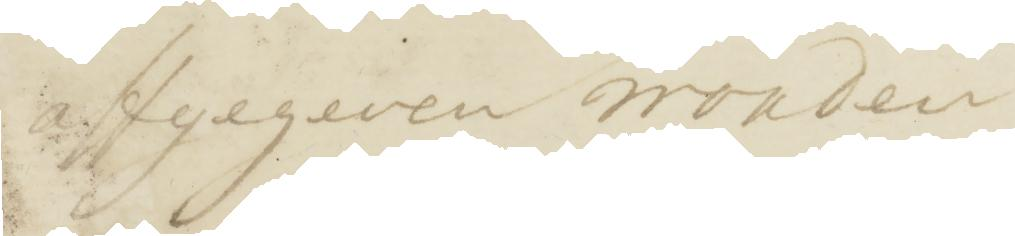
affgegeven worden
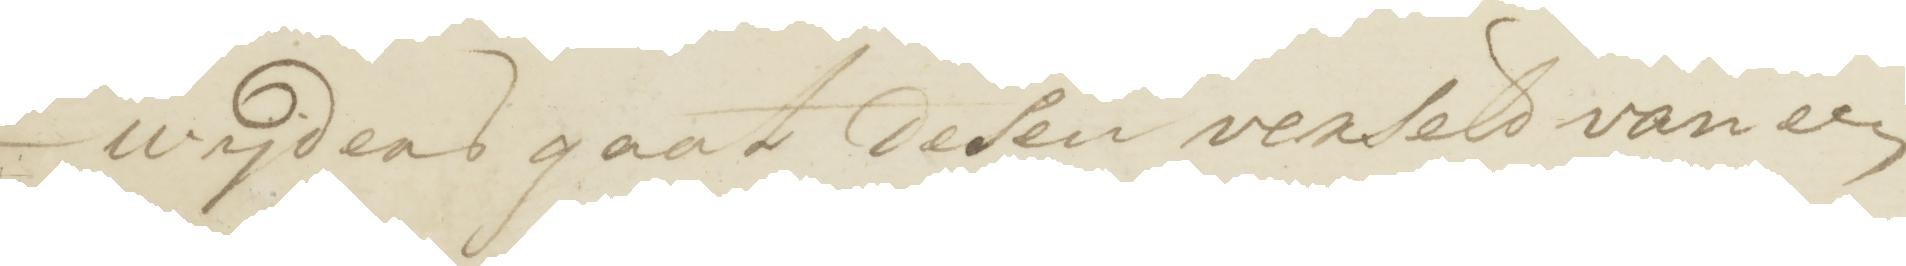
wijders gaat desen verseld van een
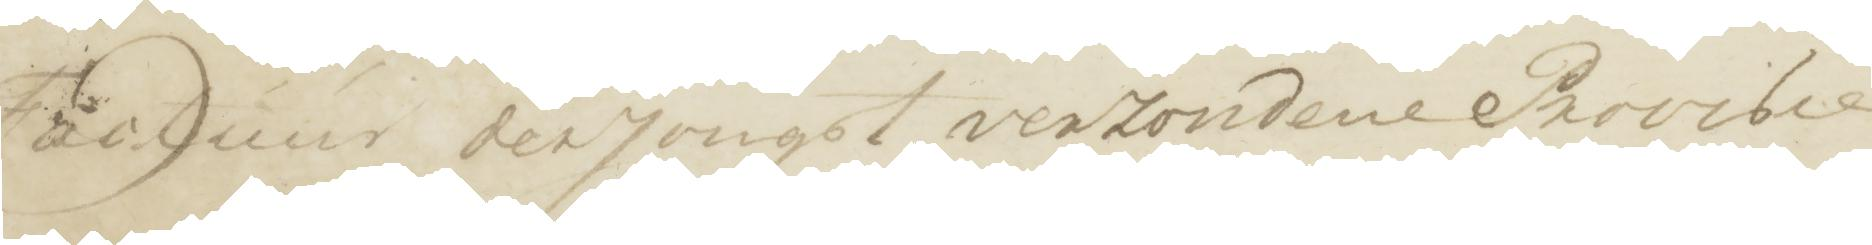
Factuur der jongst verzondene provisie
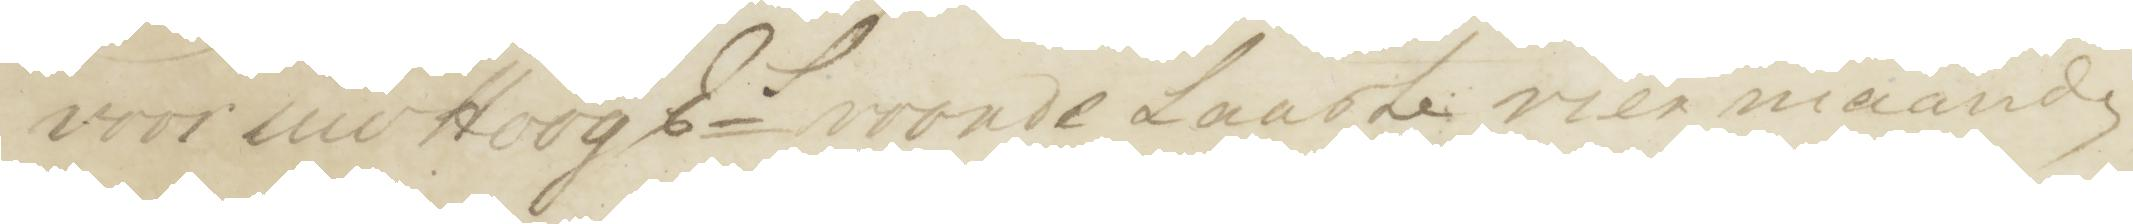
voor uw Hoog E=s voor de laaste vier maanden
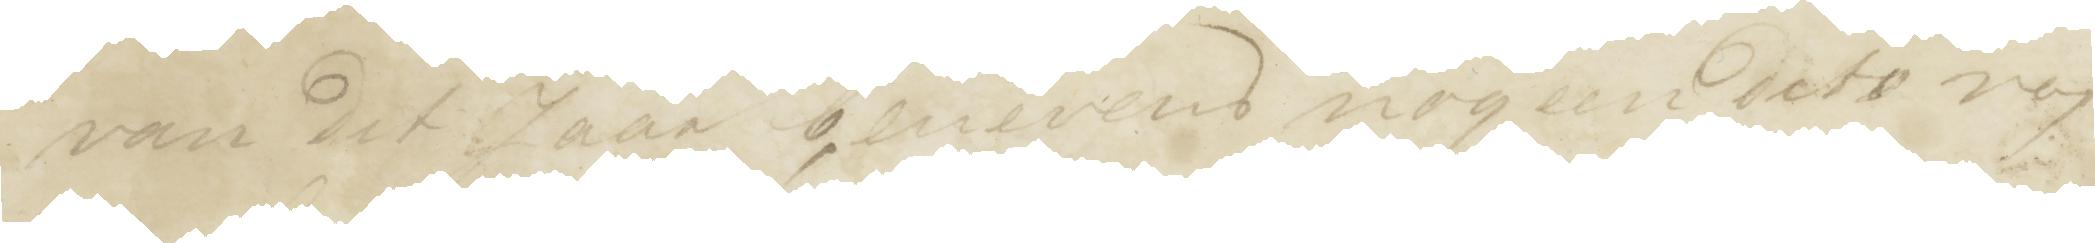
van dit Jaar benevens nog een dito van
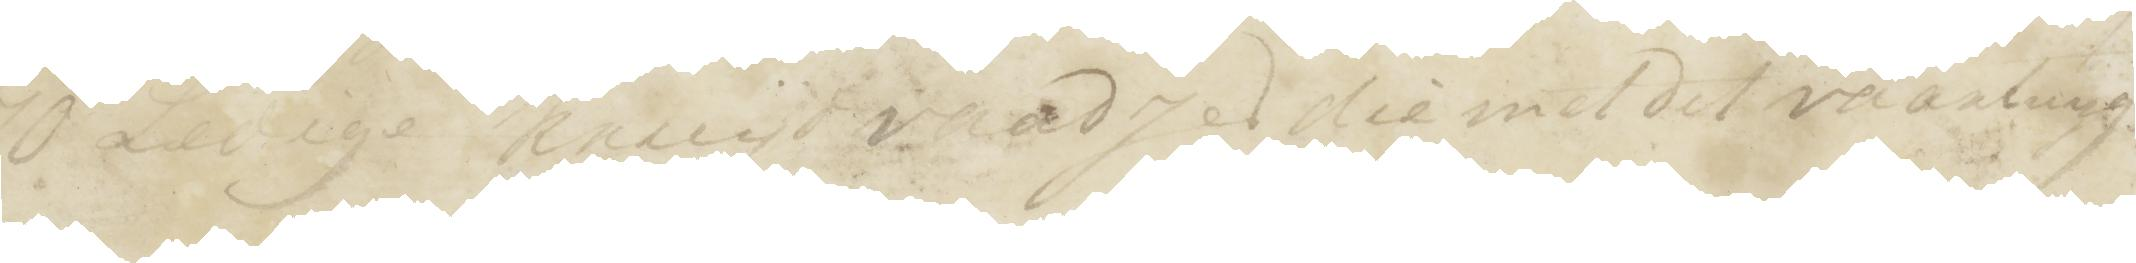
70 Levige kruijd vaadjes die met dit vaartuijg
